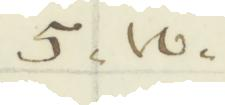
5 „ 10„
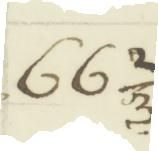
„ 66 2/3
